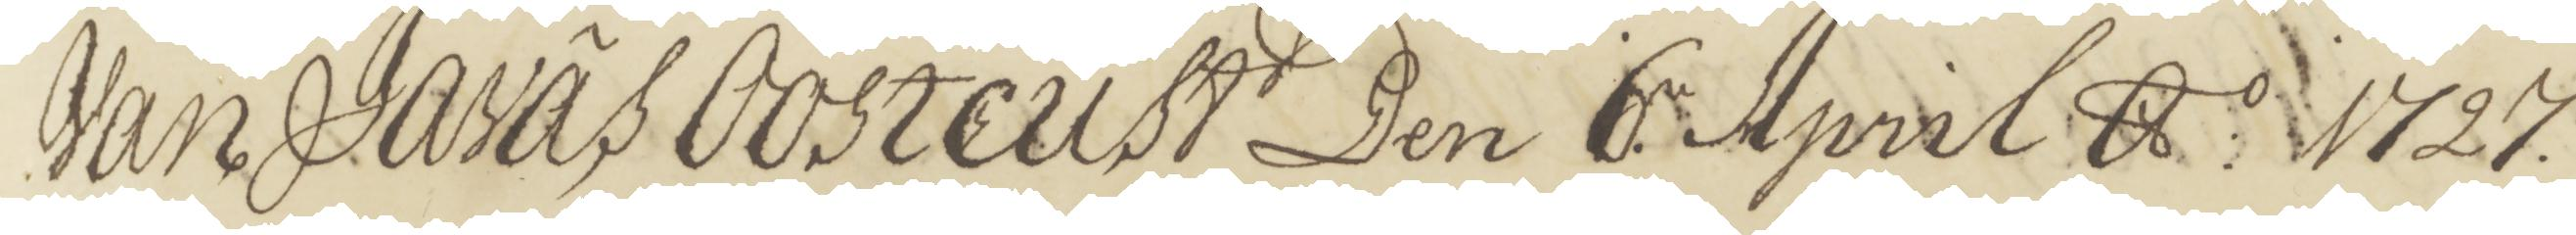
Van Java's Oostcust Den 6:e April A:o 1727.
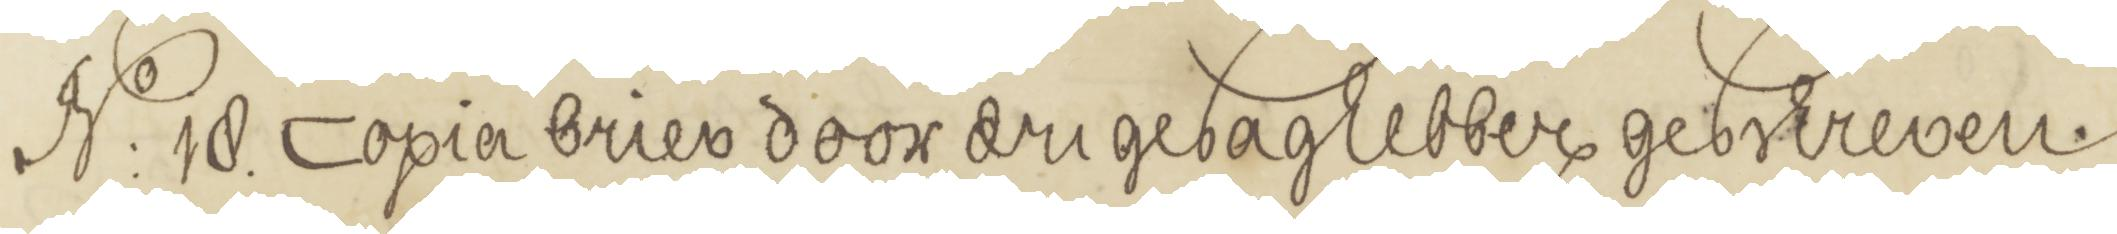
N:o 18. copia briev door den gesaghebber geschreven
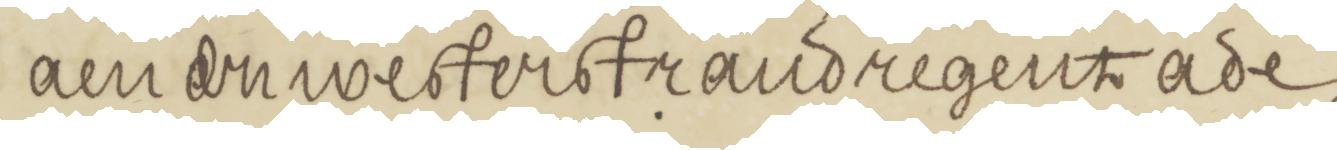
aen den westerstrand regent ade„
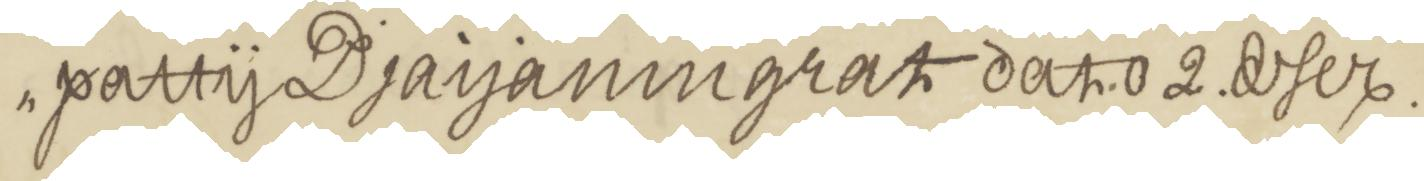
„pattij Djaijaningrat dato 2. deser.
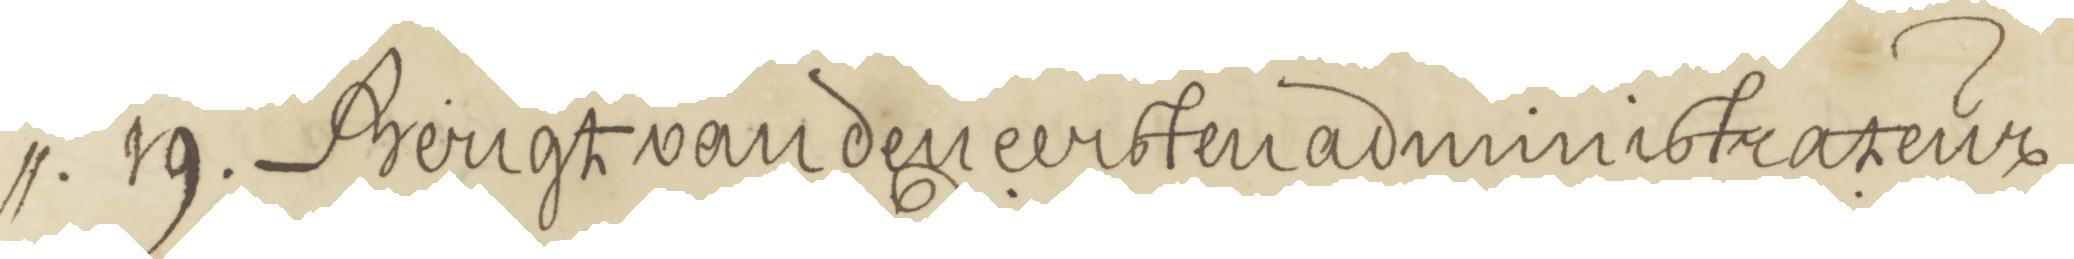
„. 19. Berigt van den eersten administrateur
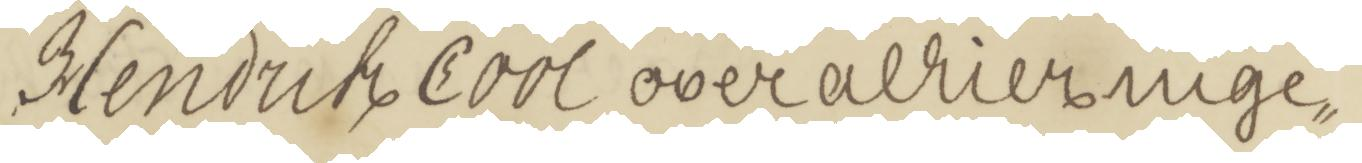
Hendrik Cool over alhier inge„
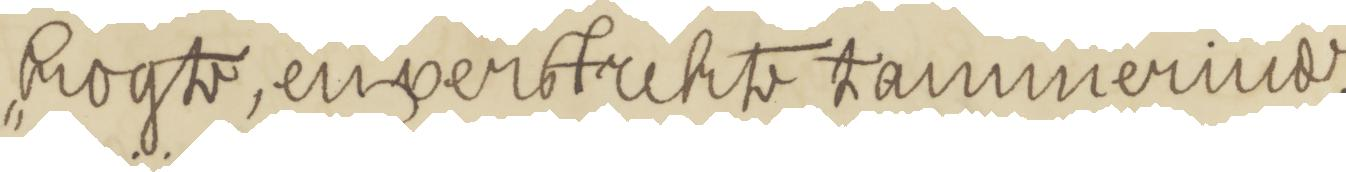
„kogte, en verstrekte tammerinde,
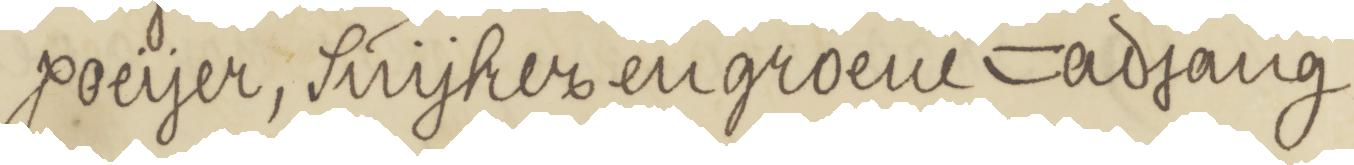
poeijer, suijker en groene cadjang
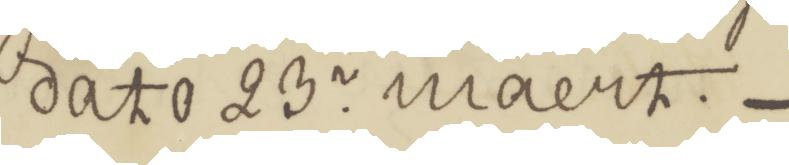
dato 23:e maert. —
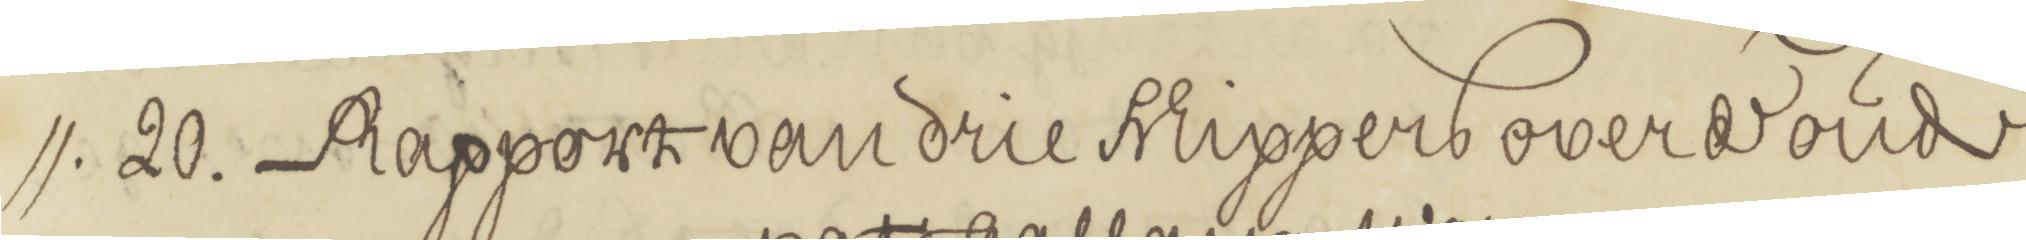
„. 20. Rapport van drie schippers over de oude
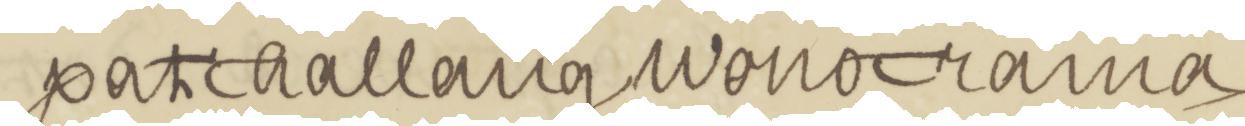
patchallang wonocrama
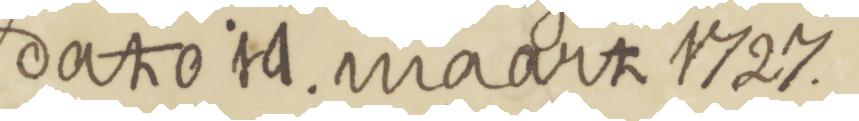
dato 14. maart 1727.
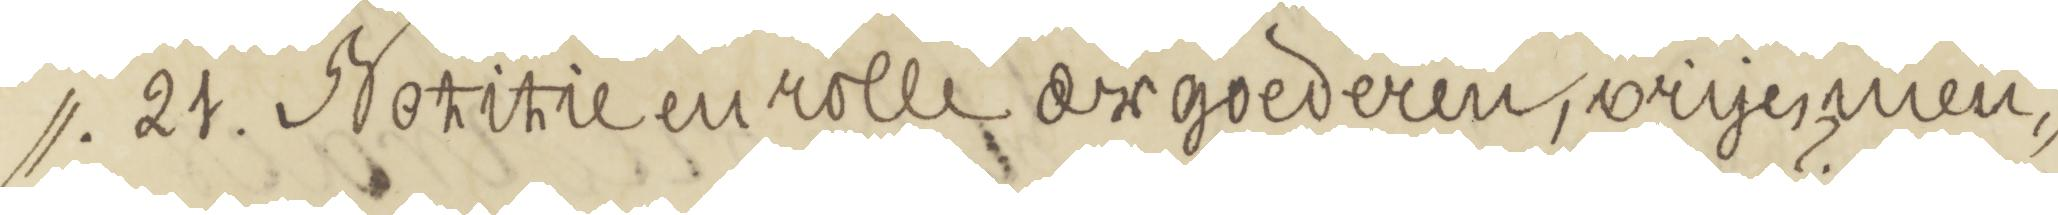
„. 21. Notitie en rolle der goederen, vrije men„
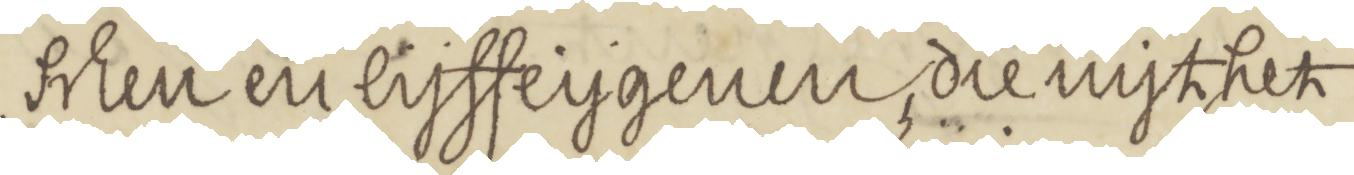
schen en lijffeijgenen die uijt het
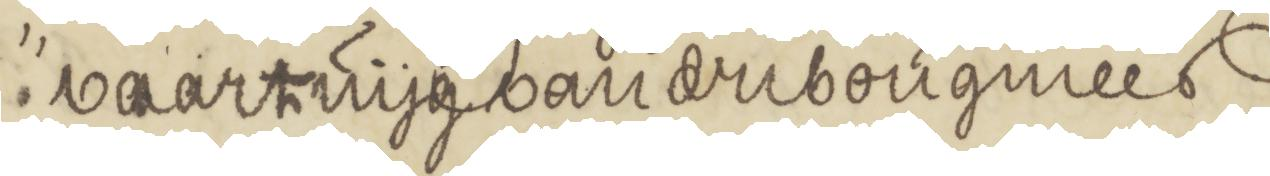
vaartuijg van den bouginees
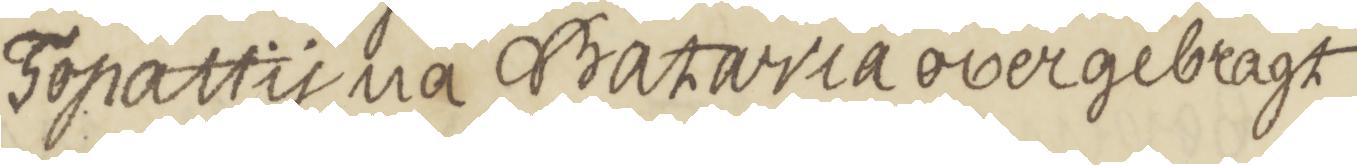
Topattij na Batavia overgebragt
